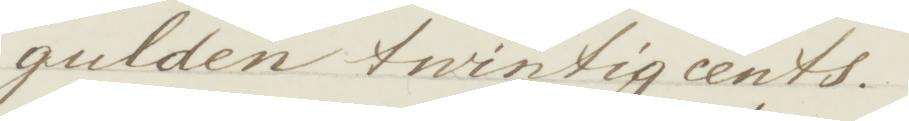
gulden twintig cents.
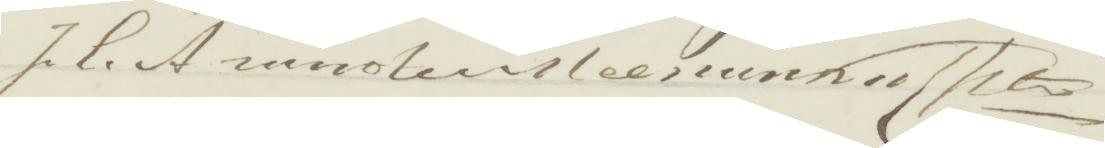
J. C. A van der Meer van Kuffeler
